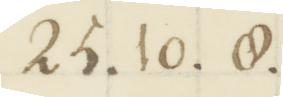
25.10. 8.
